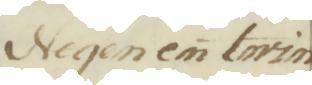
Negen en twin
